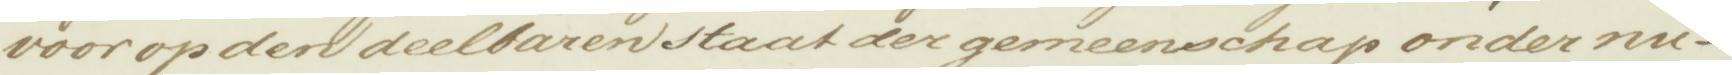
voor op den deelbaren staat der gemeenschap onder nu-
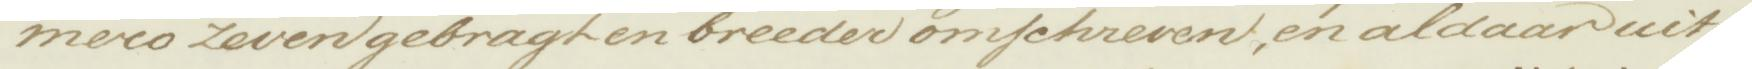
mero zeven gebragt en breeder omschreven, en aldaar uit-
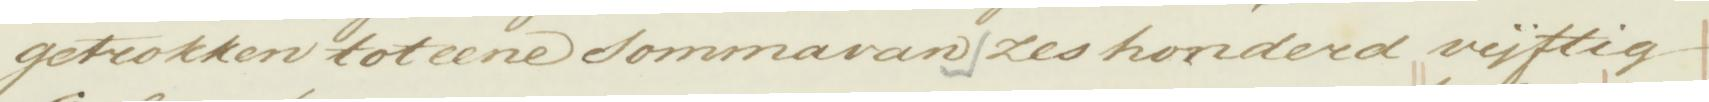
getrokken tot eene somma van | zes honderd vijftig
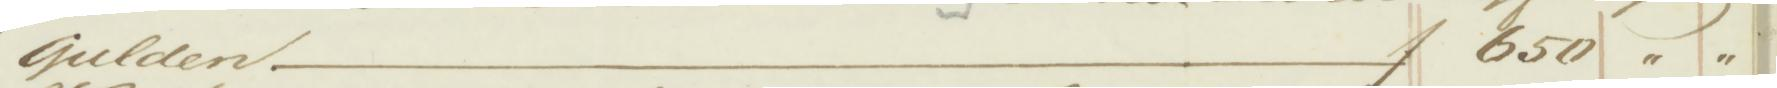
gulden ƒ 650 „ „
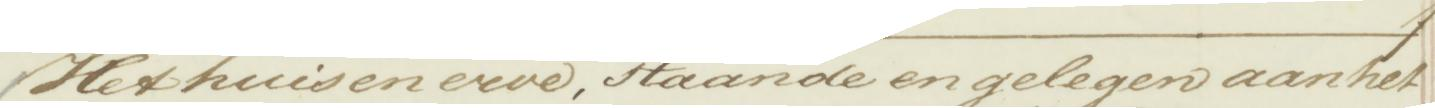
Het huis en erve, staande en gelegen aan het
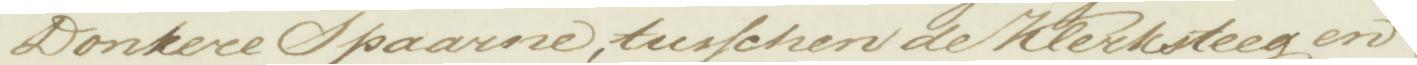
Donkere Spaarne, tusschen de Klerksteeg en
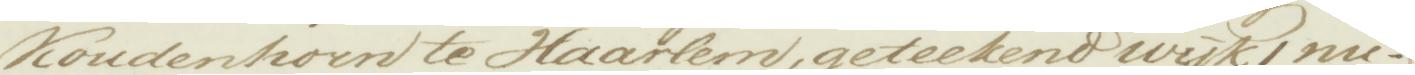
Koudenhorn te Haarlem, geteekend wijk 1 nu-
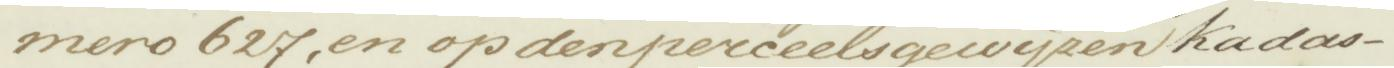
mero 627, en op den perceelsgewijzen kadas-
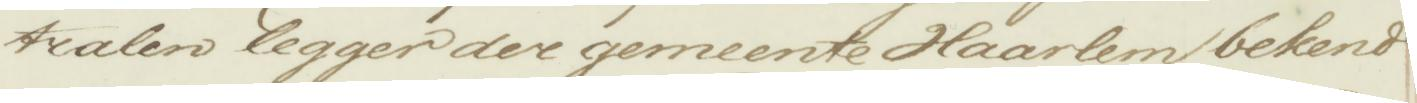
tralen legger der gemeente Haarlem bekend
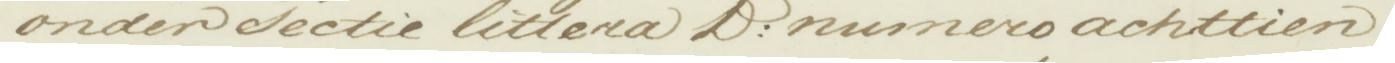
onder sectie littera D: numero achttien
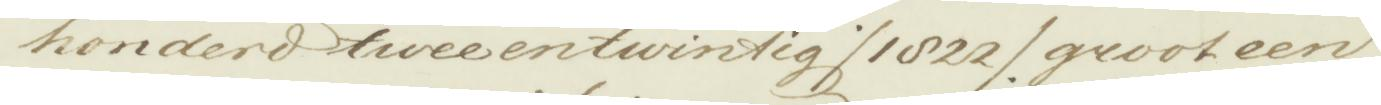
honderd twee en twintig '/1822/. groot een
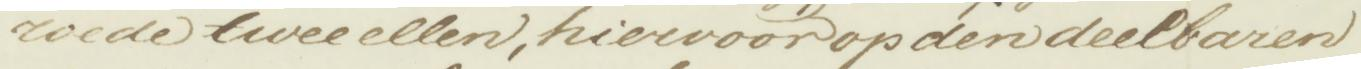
roede twee ellen, hiervoor op den deelbaren
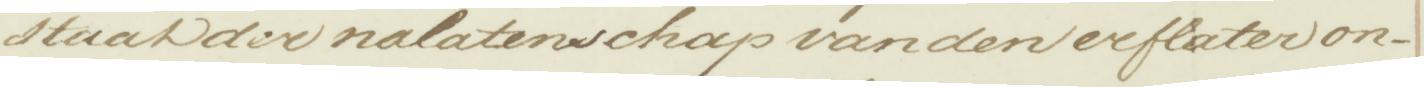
staat der nalatenschap van den erflater on-
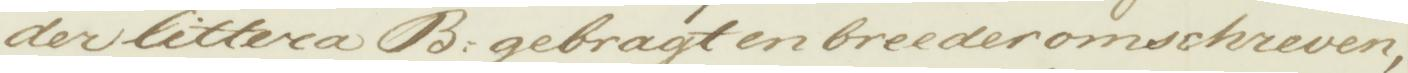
der littera B: gebragt en breeder omschreven,
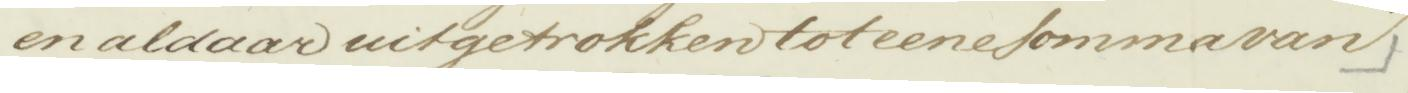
en aldaar uitgetrokken tot eene somma van |
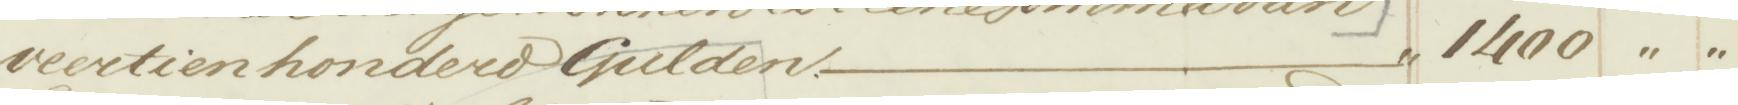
veertien honderd Gulden. „ 1400 „ „
